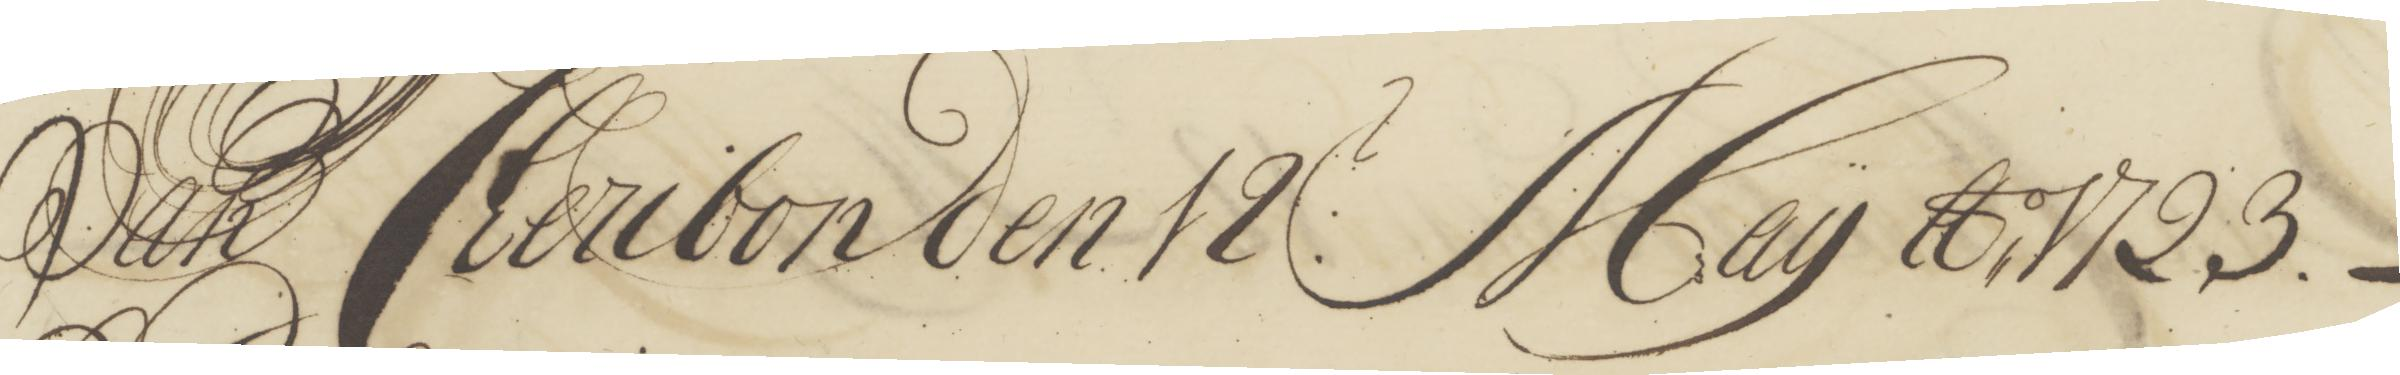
Van Cheribon den 12:' Maij A„o 1723. —
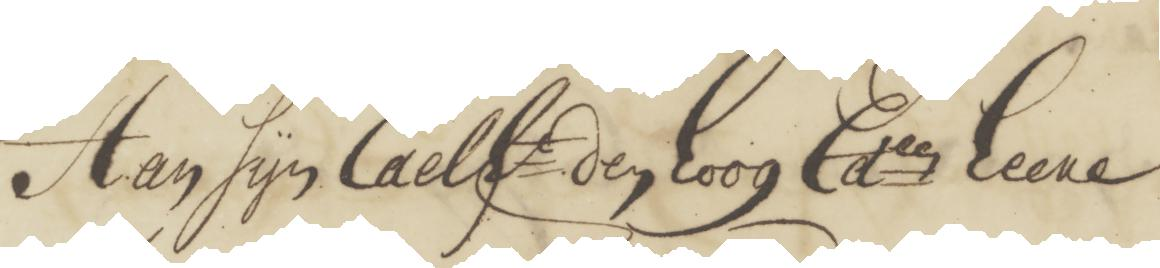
Aan Sijn Edelh=t den hoog Ed=le heere
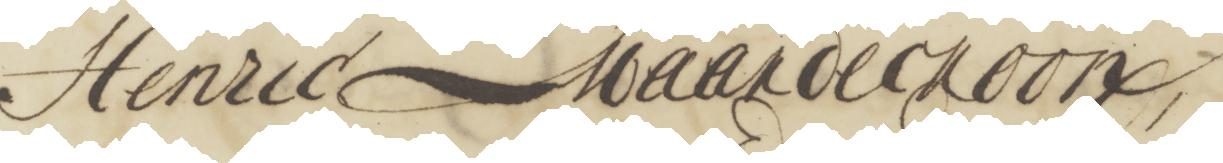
Henric Zwaardecroon,
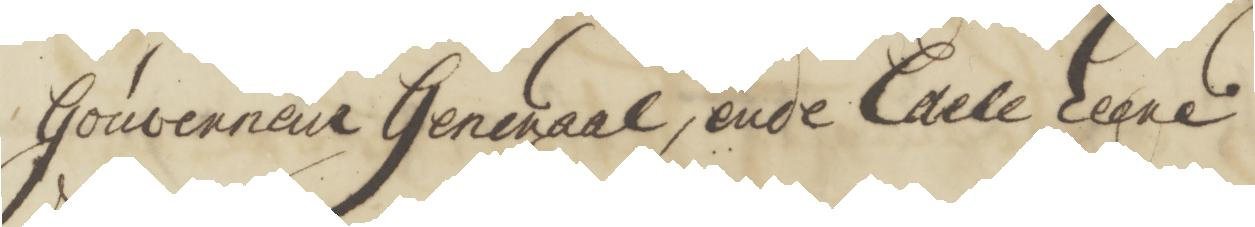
Gouverneur Generaal, ende Edele heere
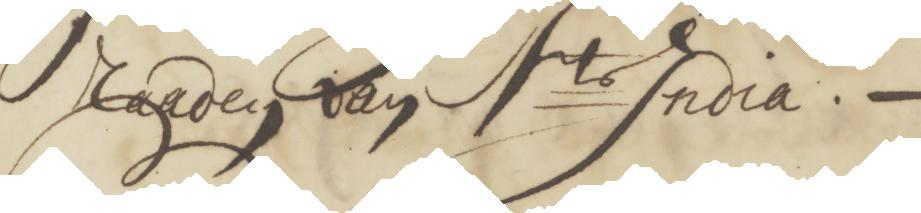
Raaden van N=ts Jndia. —
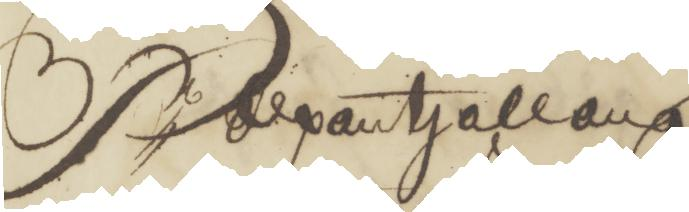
P„r de pantjallang
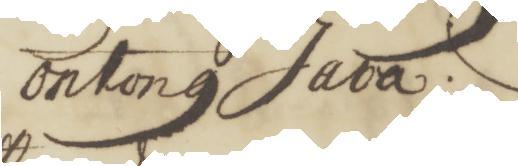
ontong Java:
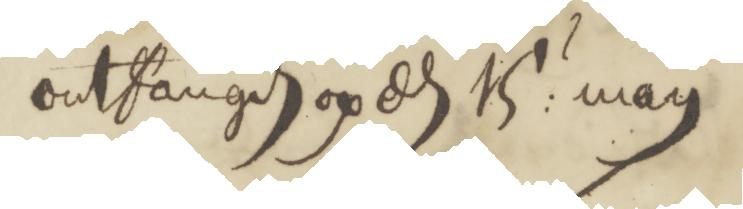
ontfangen op den 15:' maij
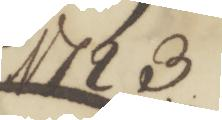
1723
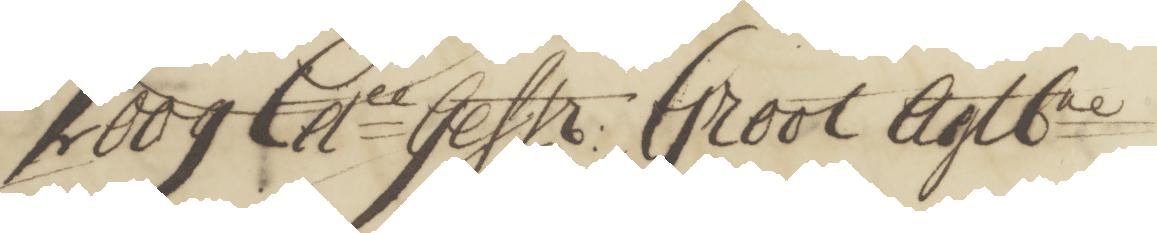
Hoog Ed=le Gestr: Groot Agtb=re
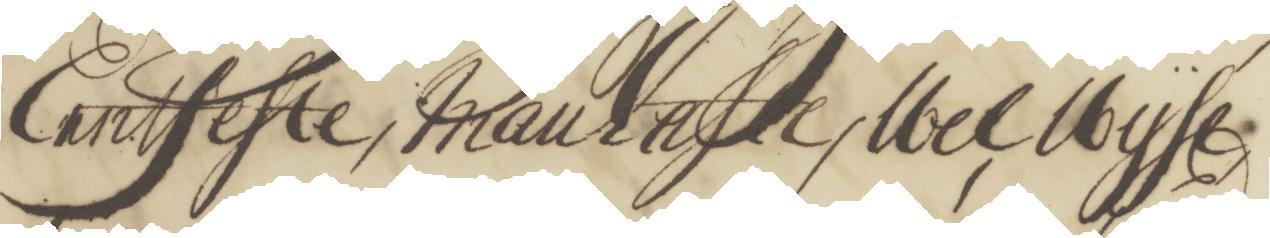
Erntfeste, manhafte, Wel Wijse,
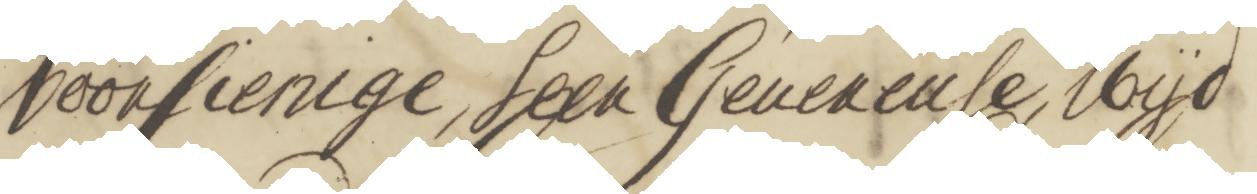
voorsienige, Seer Genereuse, Wijd
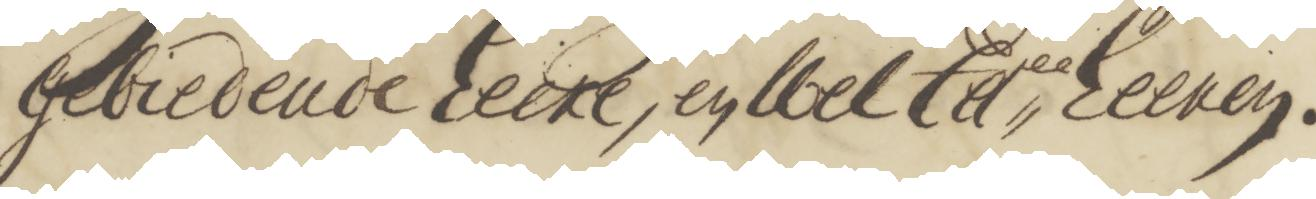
gebiedende heere, en Wel Ed„le heeren.
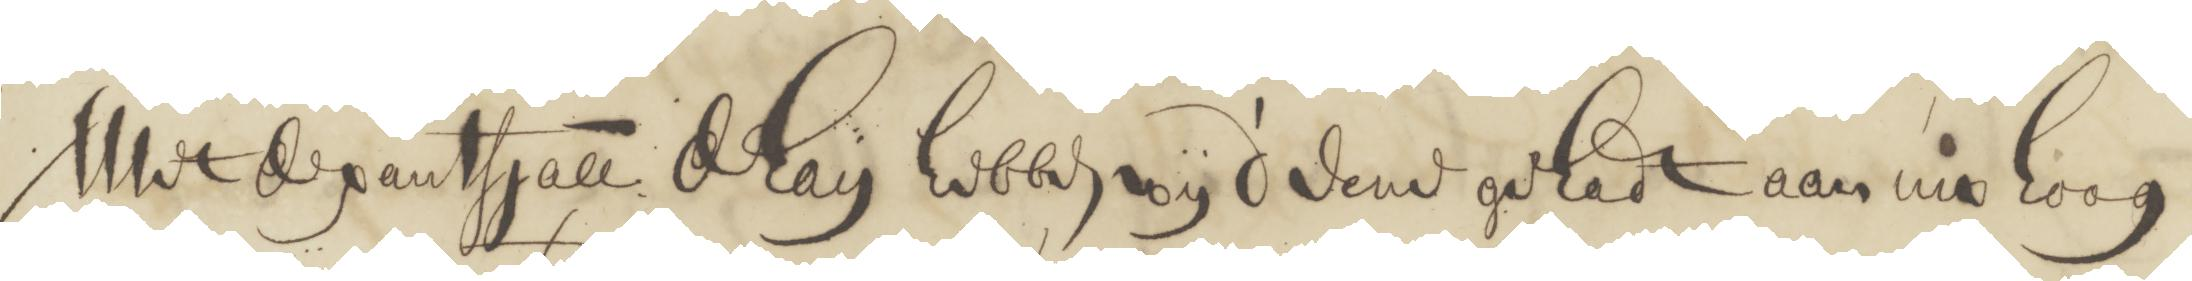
Met de pantsjall. de haij hebben wij d' Eere gehadt aan uw hoog
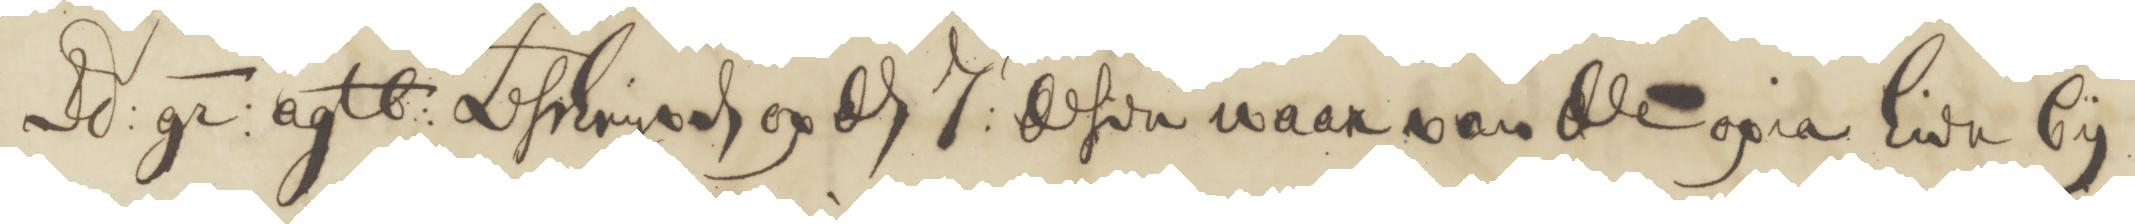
Ed: gr: agtb: te schrijven op den 7:' desen waar van de Copia hier bij
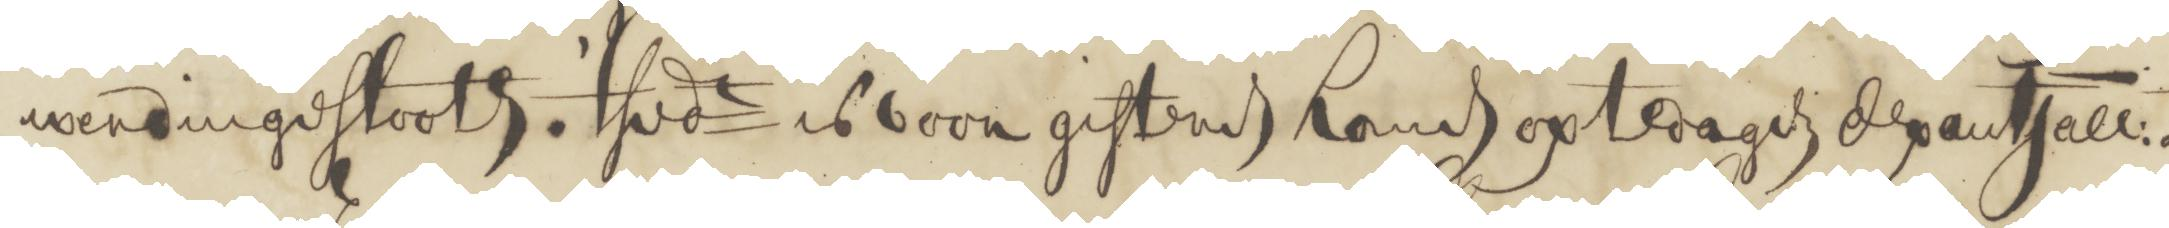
werd ingeslooten. 't sed=t is voor gisteren komen op tedagen de pantjall:
